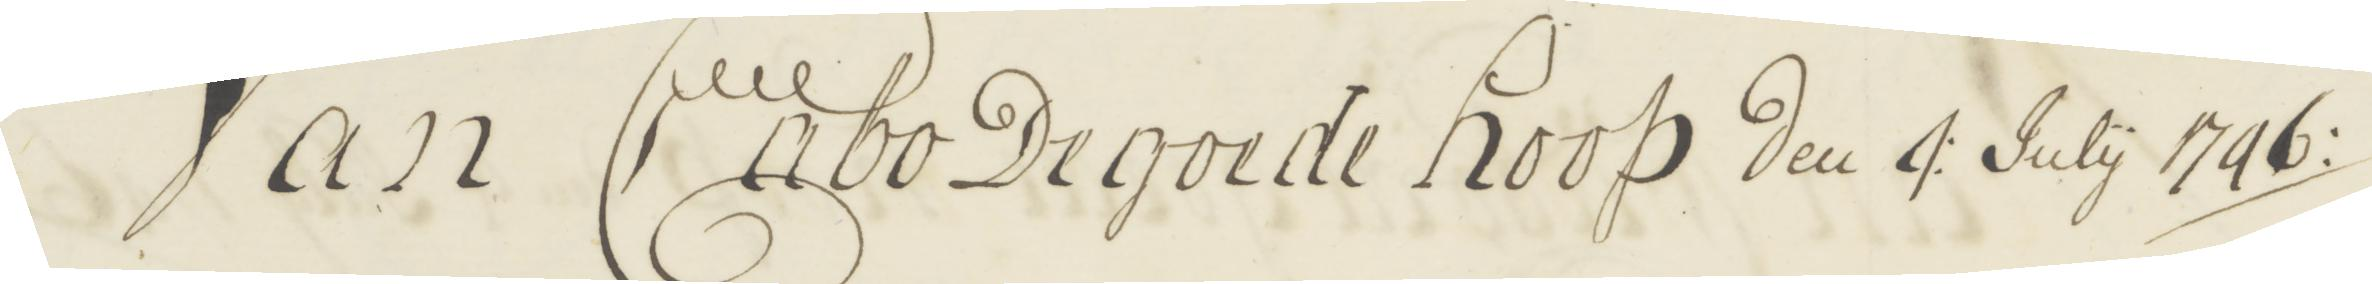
Van Cabo De goede hoop den 4: Iulij 1746:
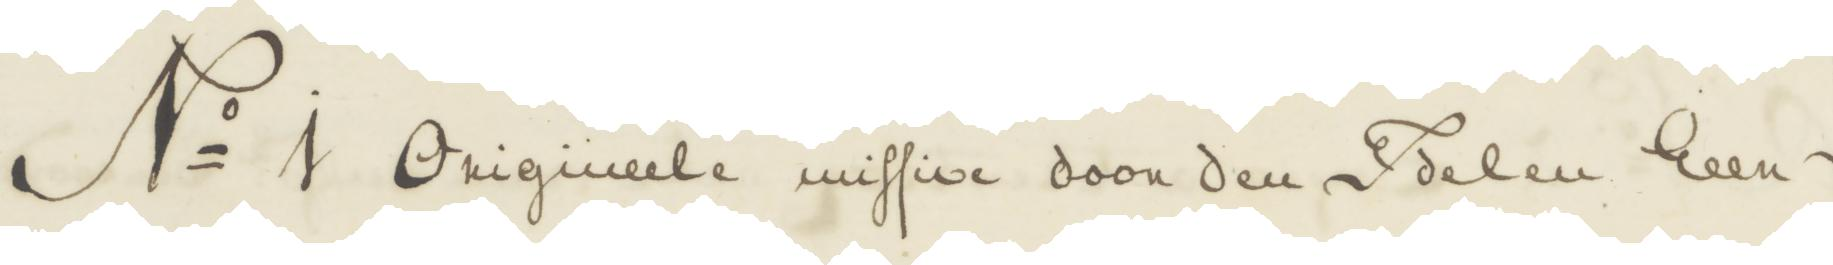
N=o 1 Origineele missive door den Edelen heer
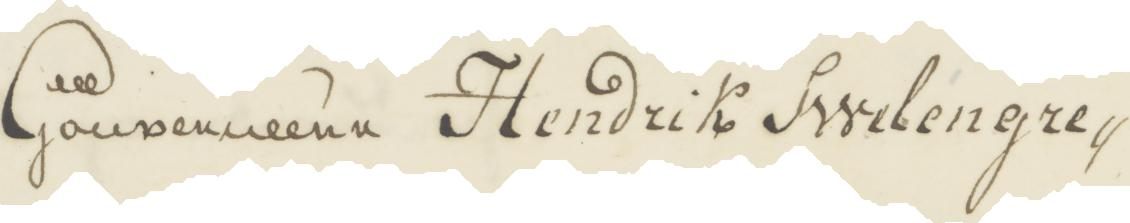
Gouverneeur Hendrik Swelengre„
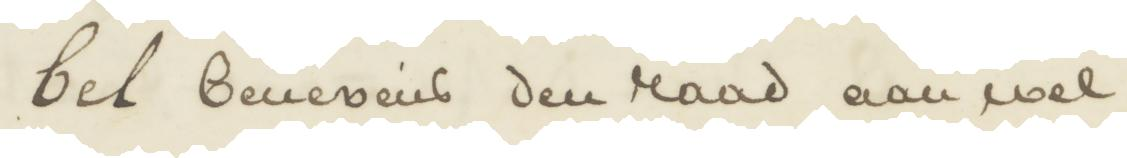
bel benevens den raad aan wel
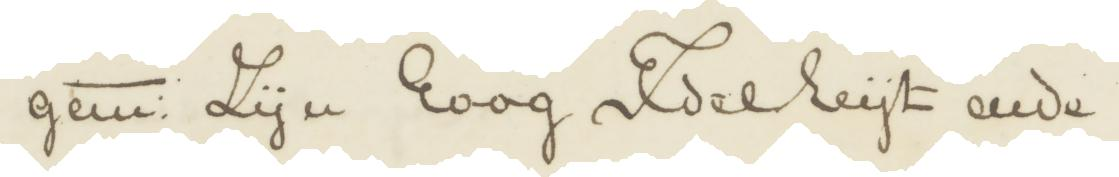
gem: zijn hoog Edelheijt ende
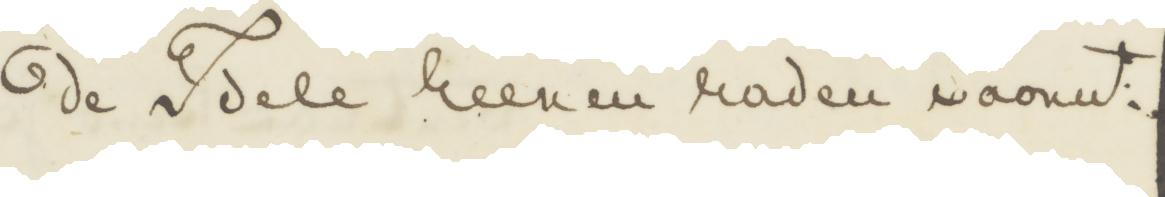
de Edele heeren raden voorn:t
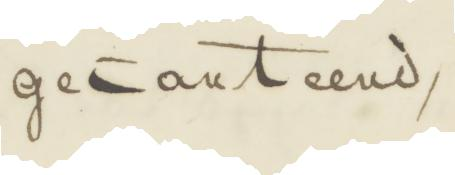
gecarteerd,
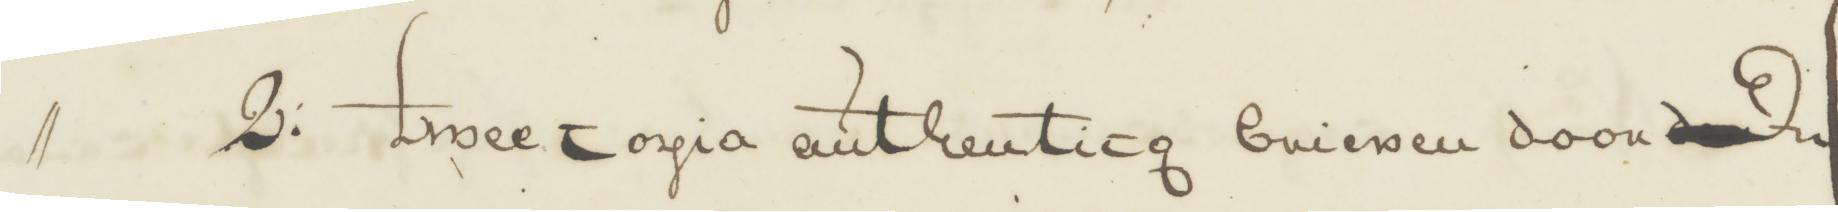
„ 2: twee copia authenticq brieven door de En
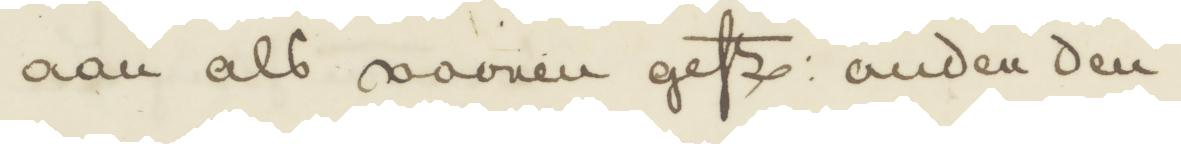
aan als vooren gesz: onder den
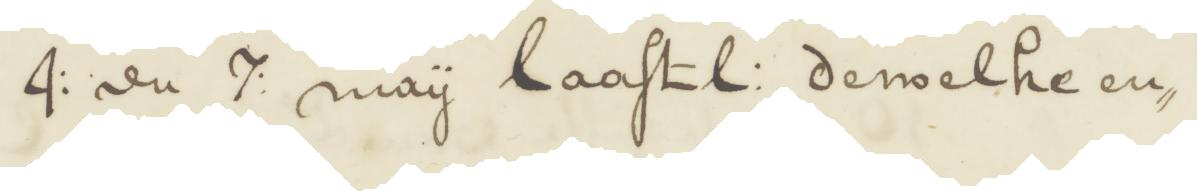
4: en 7: maij laastl: dewelke en„
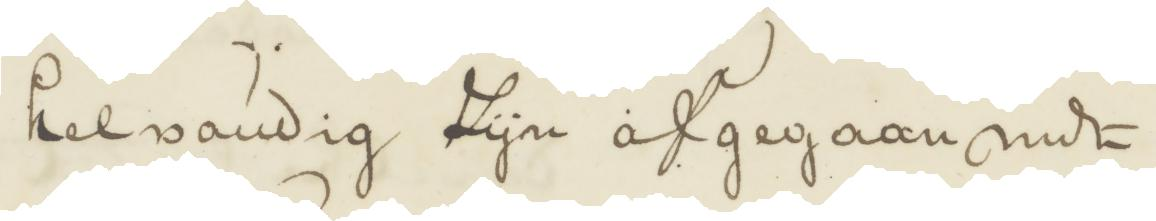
kelvoudig zijn afgegaan met
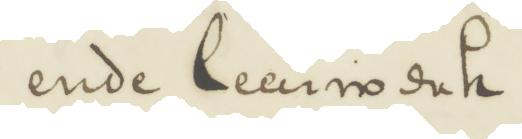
ende leeuwerk
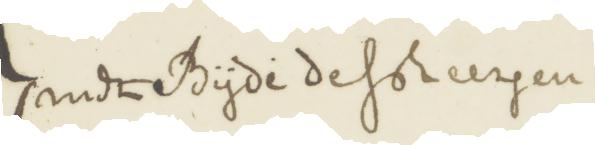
met Bijde descheepen
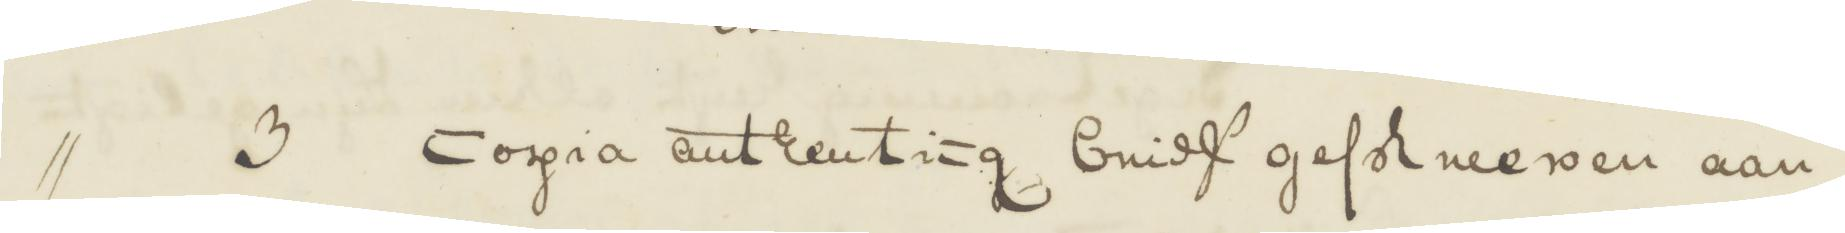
„ 3 Copia anthenticq brief geschreeven aan
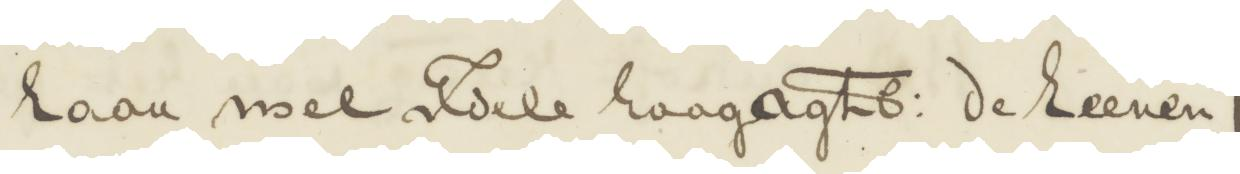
haar wel Edele hoogagtb: de heeren
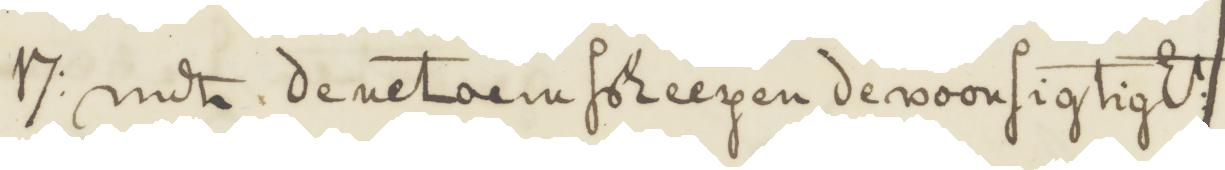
17: met de retour scheepen de voorsigtigh:t
